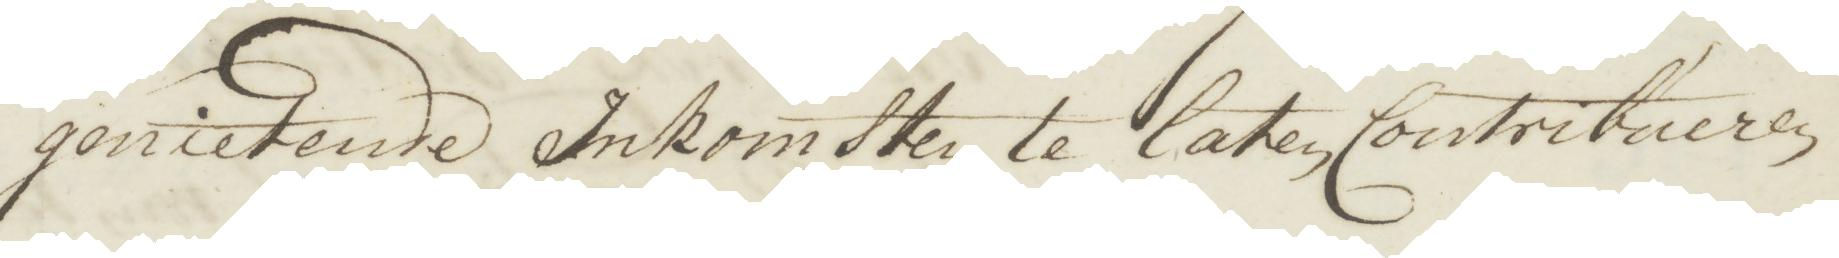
genietende Inkomsten te laten Contribueren
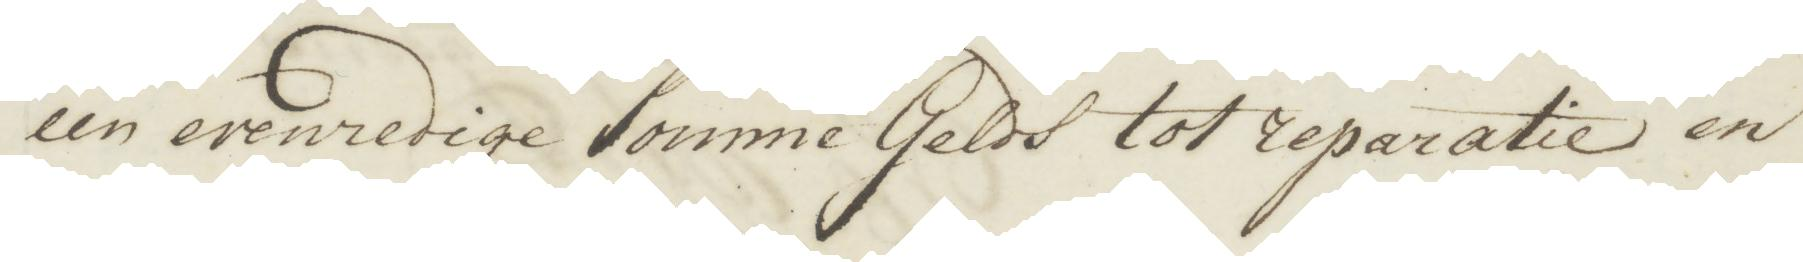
een evenredige Somme Gelds tot reparatie en
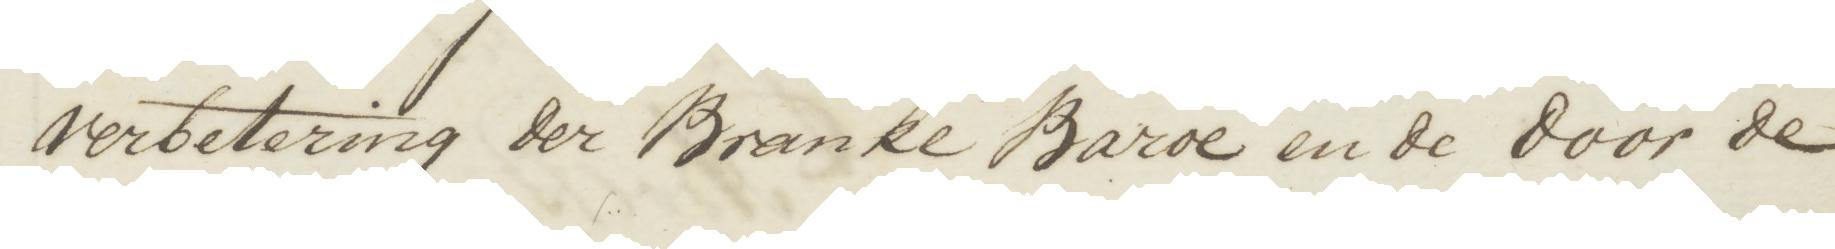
verbetering der Branke Baroe en de door de
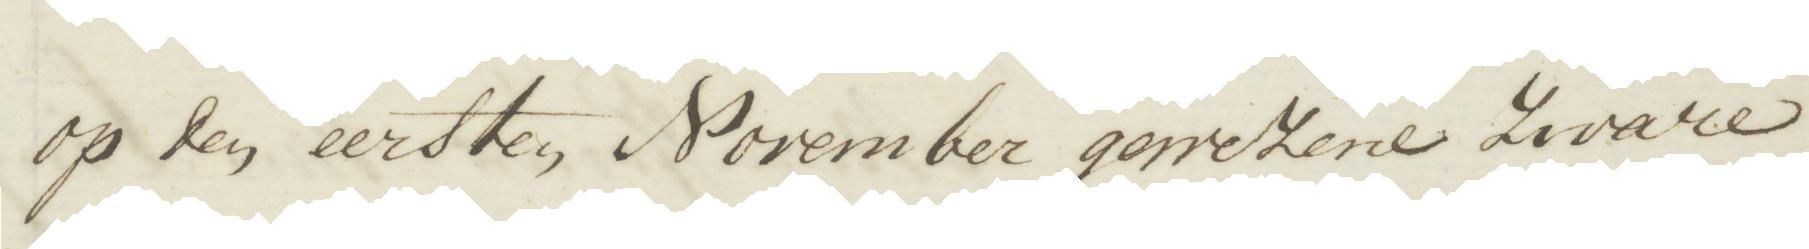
op den eersten November gewezene Zware
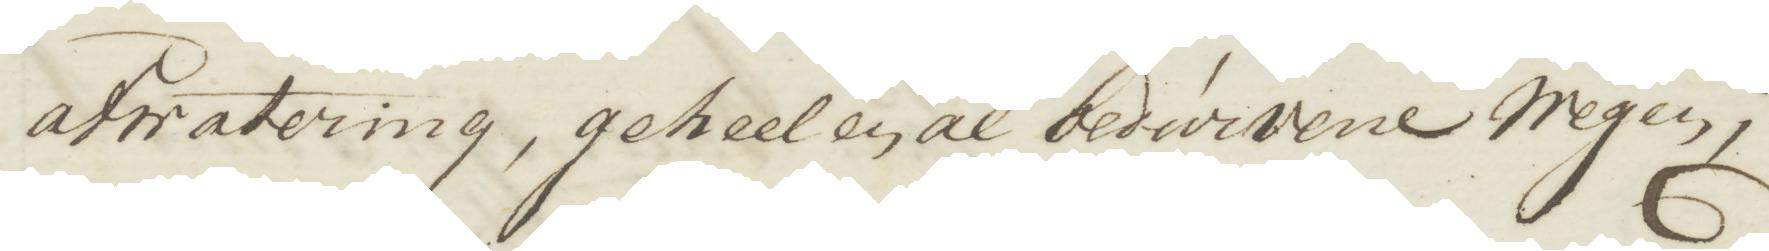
afwatering, geheel en al bedurvene wegen;
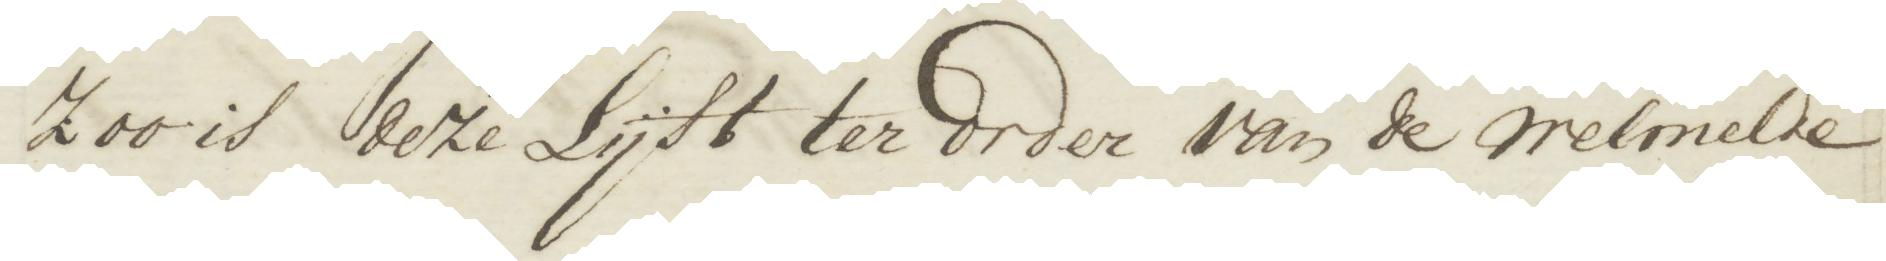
Zoo is deze Lijst ter order van de welmelde
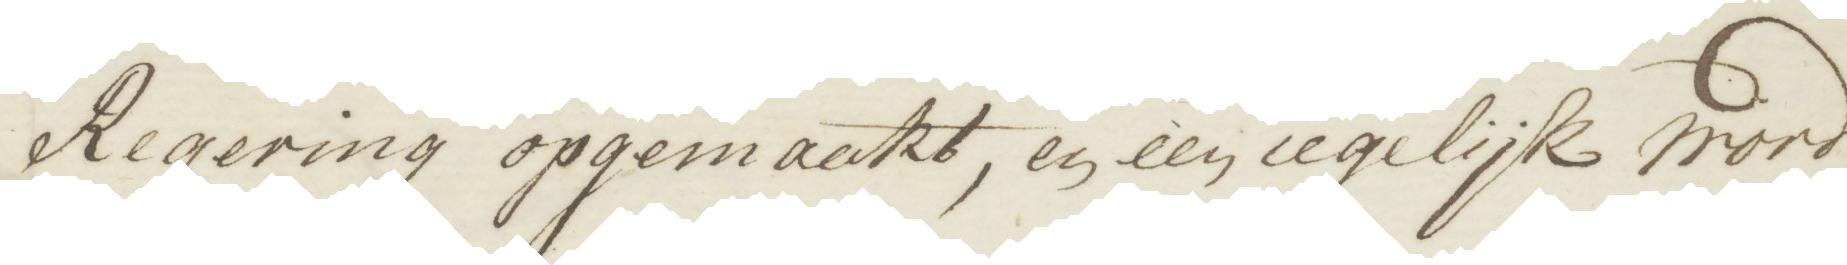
Regering opgemaakt, en een iegelijk word
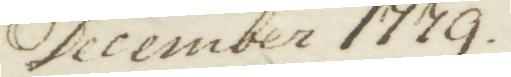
December 1779.
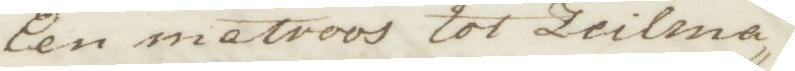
Een matroos tot Zeilma„
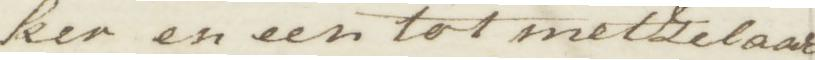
ker en een tot metzelaar
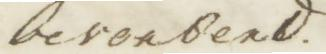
bevorderd.
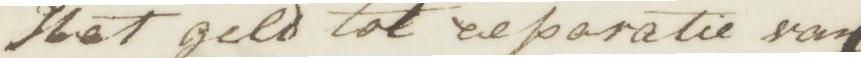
Het geld tot reparatie van
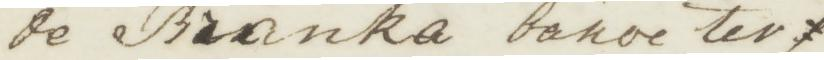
de Branka baroe ter ƒ
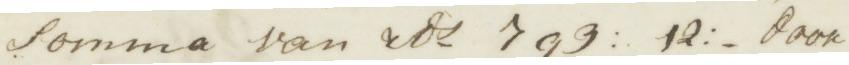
Somma van rd=s 793: 12: — door
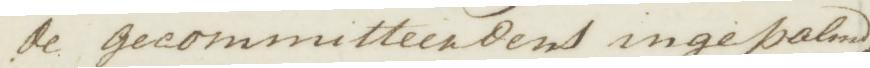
de gecommitteerdens ingepalmd
